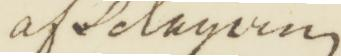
afschryven
